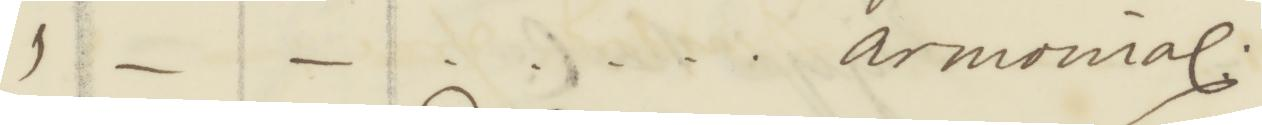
1 — — - - - - - armoniac.
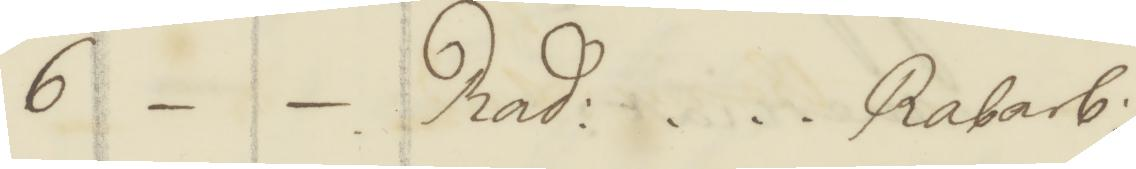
6 — — Rad: - - - Rabarb:
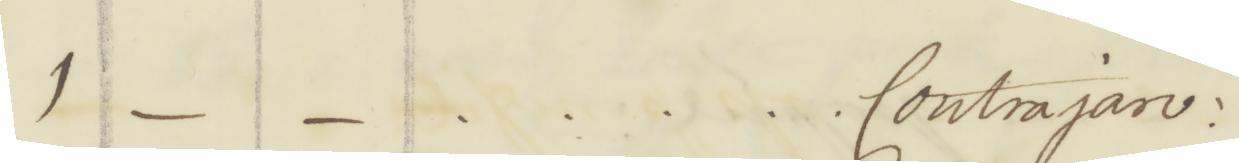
1 — — - - - - - Contrajan:
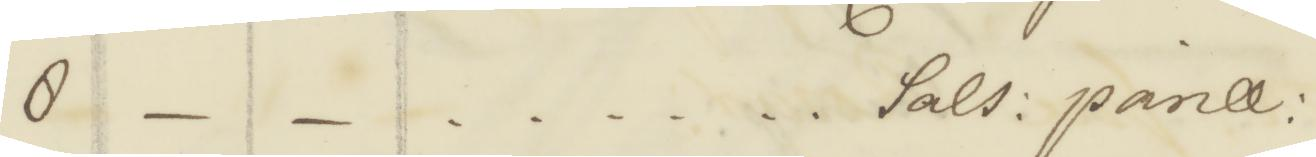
8 — — - - - - - - sals: panll:
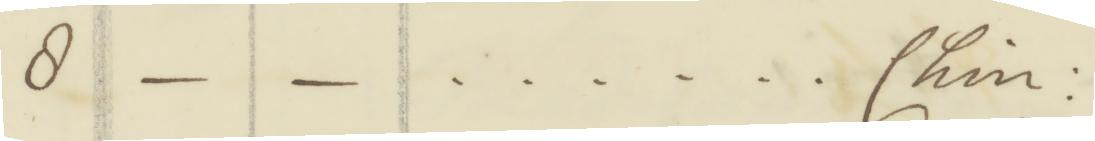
8 — — - - - - - - Chin:
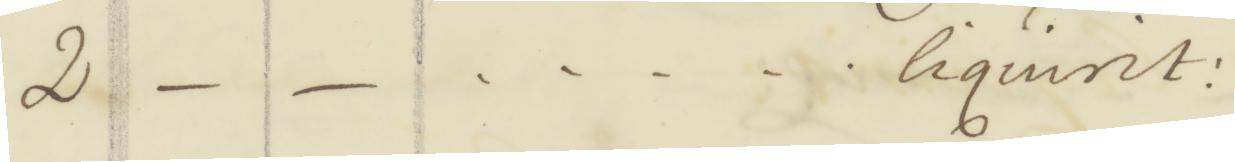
2 — — - - - - - liquirit:
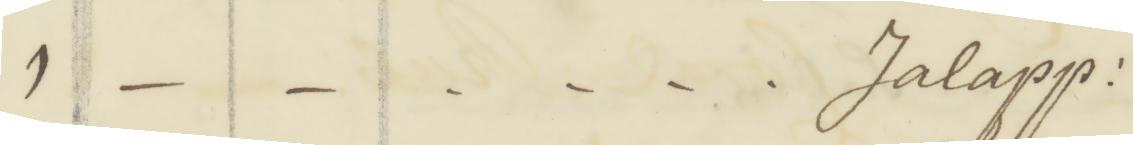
1 — — - - - - Jalapp:
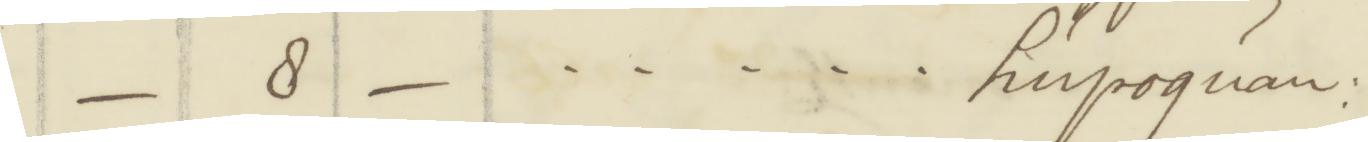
— 8 — - - - - - hupoquan:
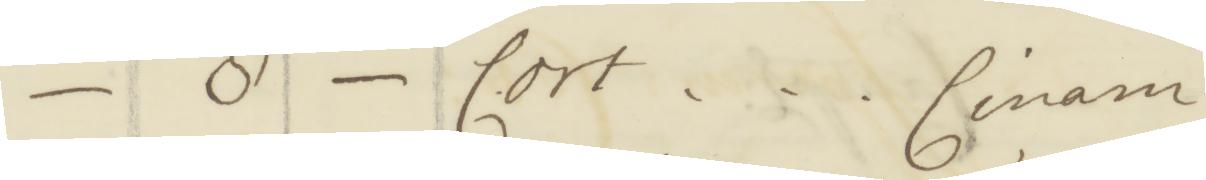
— 8 — Cort - - - Cinam
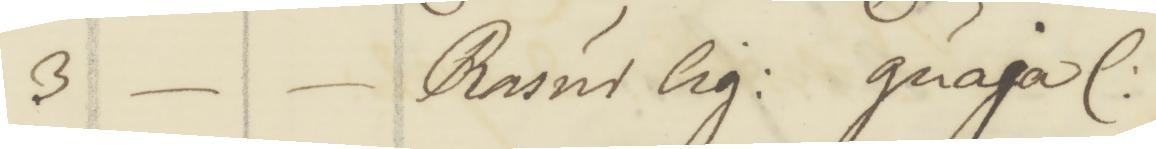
3 — — Rasur lig: guaja C:
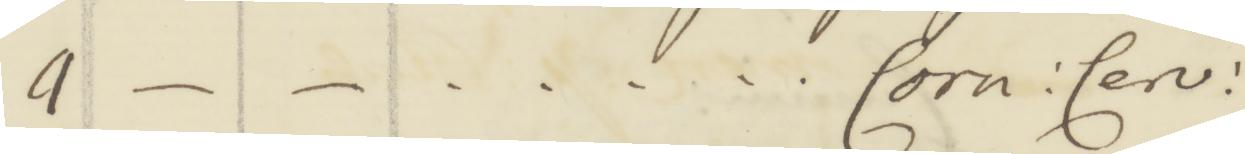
4 — — - - - - - Corn: Cen:
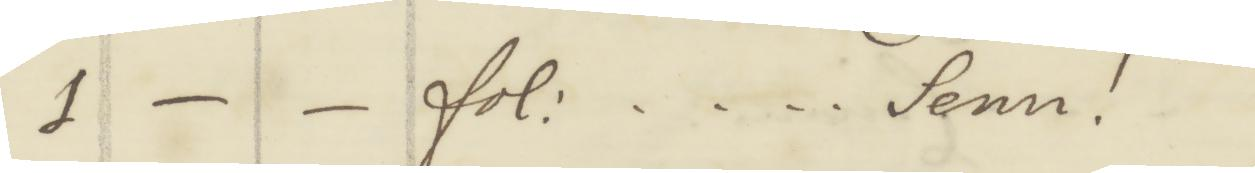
1 — — fol: - - - - Senn!
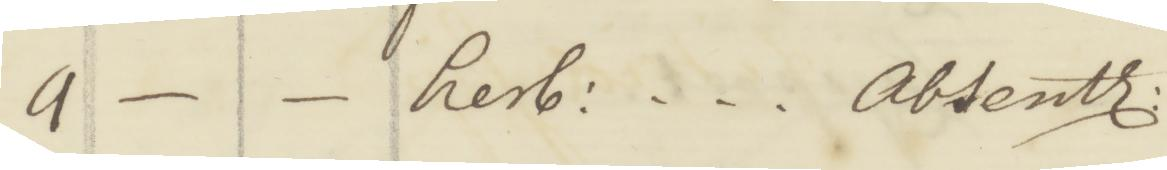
4 — — herb: - - - Absenth:
